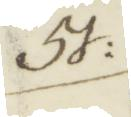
51:
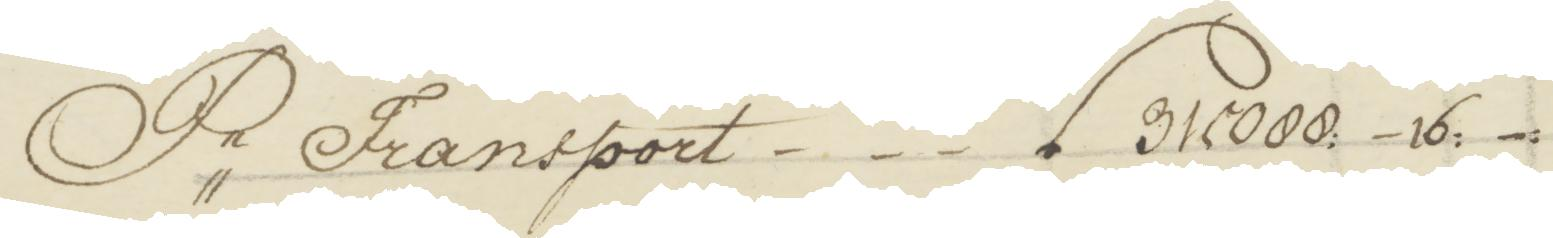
P„r Transport ƒ 315088: — 16: —:
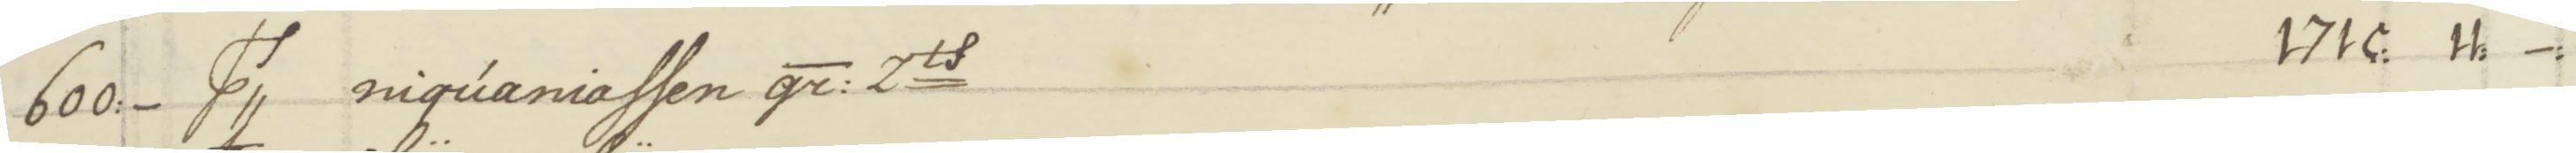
600: — p„s niquaniassen gr: z=ts 1715: 11: —:
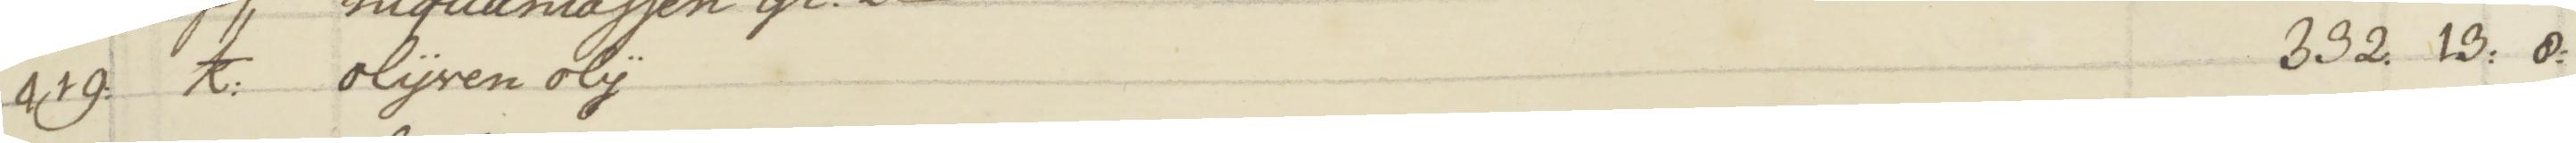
419: k: olijven olij 332: 13: 8:
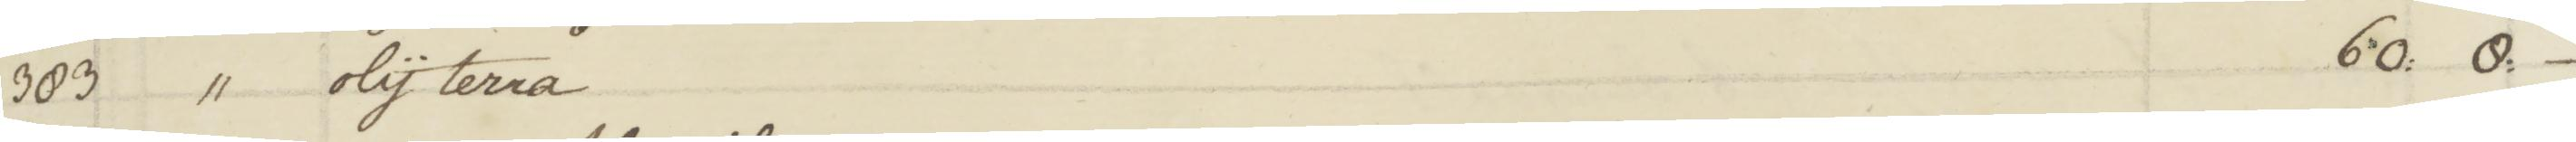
383 „ olij terra 60: 8: —
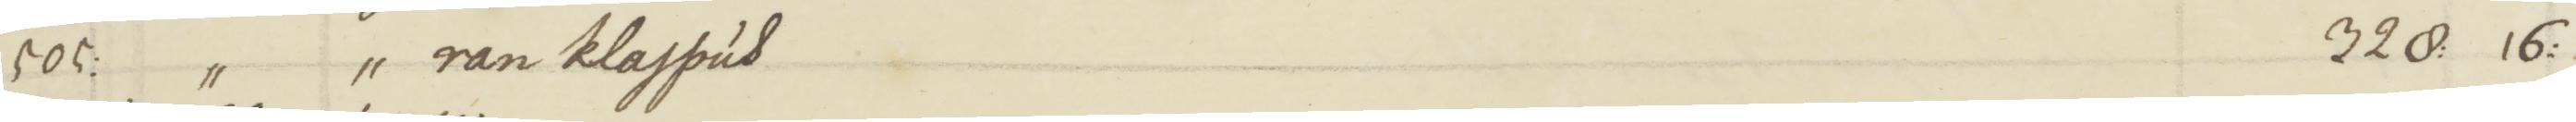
505: „ „ van klappus 328: 16: —
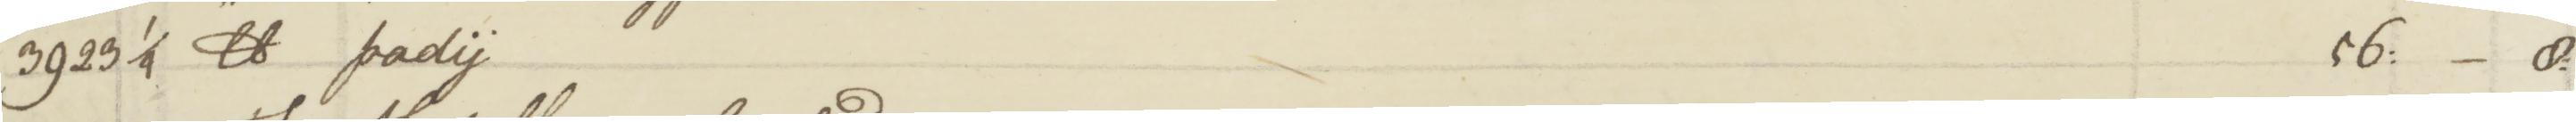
3923 ¼ lb padij 56: — 8:
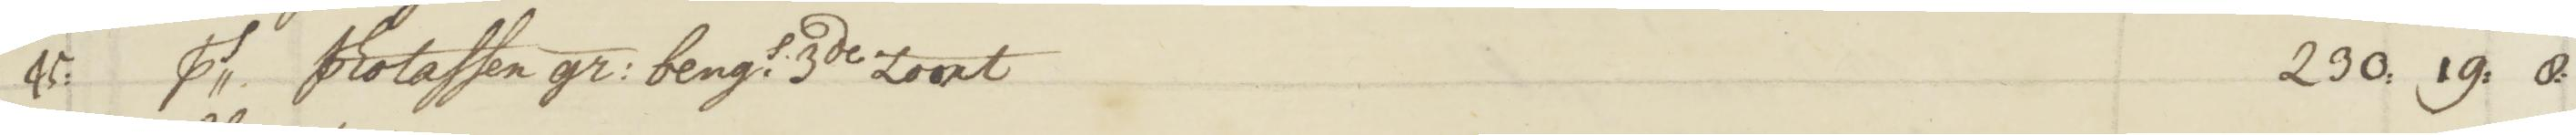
45: p„s photassen gr: beng:s 3:de zoort 230: 19: 8:
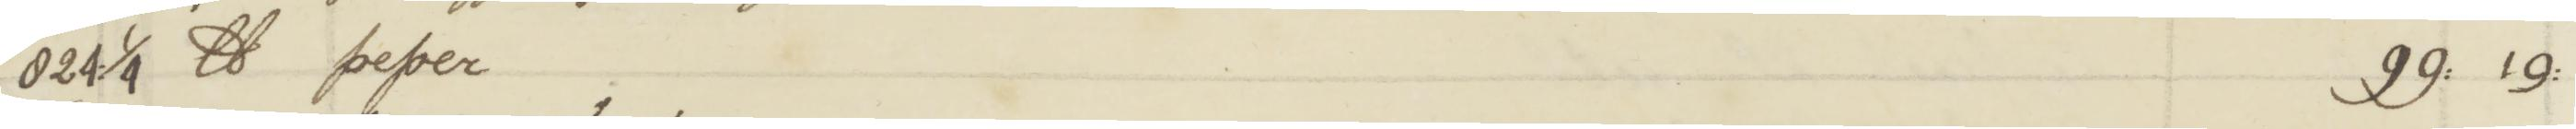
824: ¼ lb peper 99: 19: —
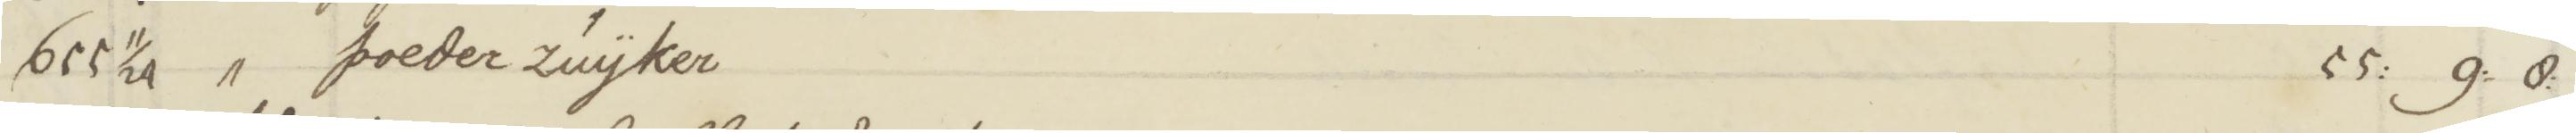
655 11/24 „ poeder zuijker 55: 9: 8:
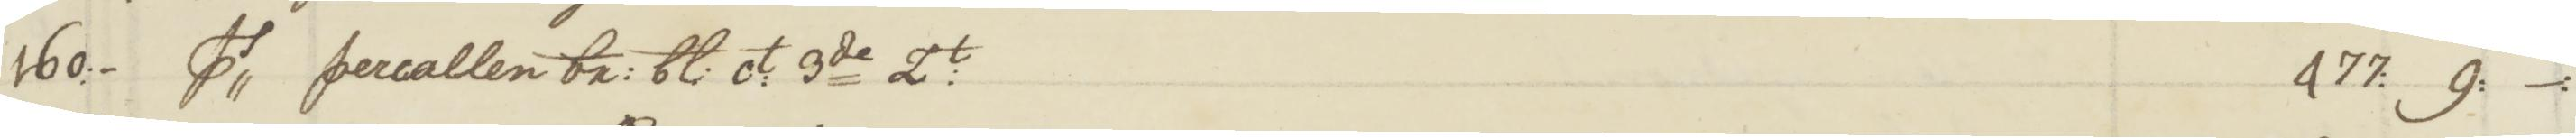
160: — p„s percallen br: bl: c:t 3=de z:t 477: 9: —:
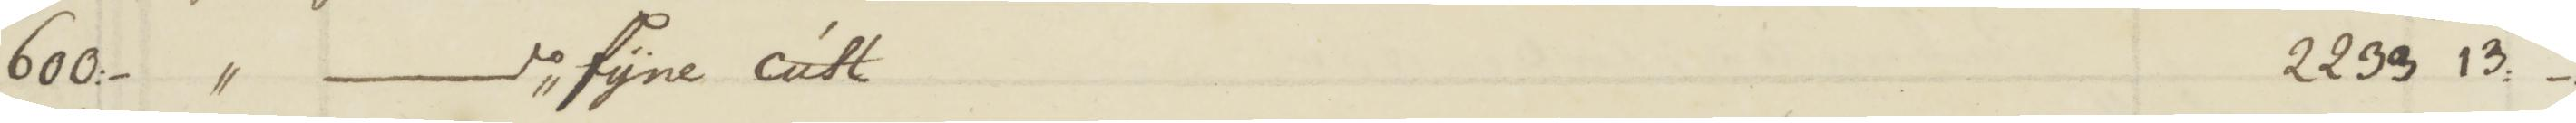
600: — „ —:o fijne cust 2233 13: —:
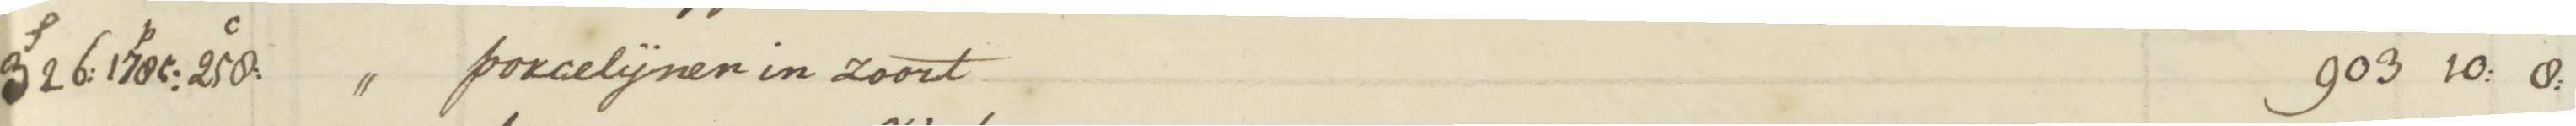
326: 1785: 258: „ porcelijnen in zoort 903 10: 8:
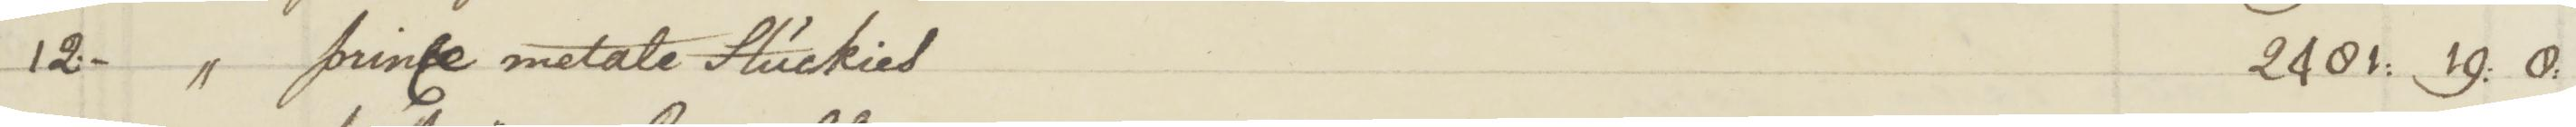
12: — „ prince metale stuckies 2481: 19: 8:
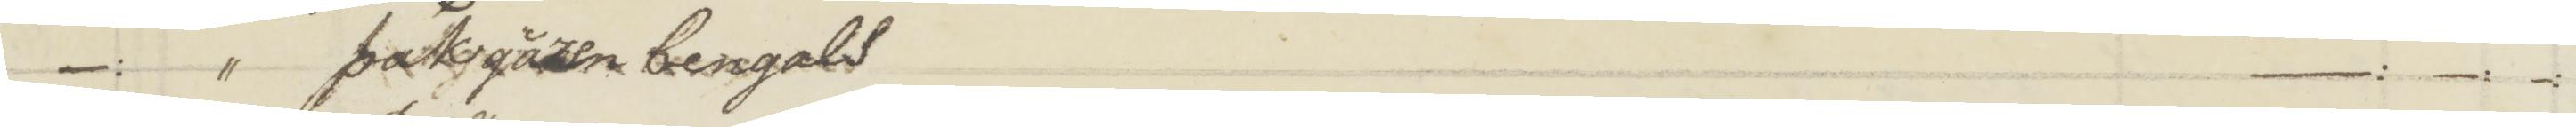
—: „ pak garren bengals —: —: —:
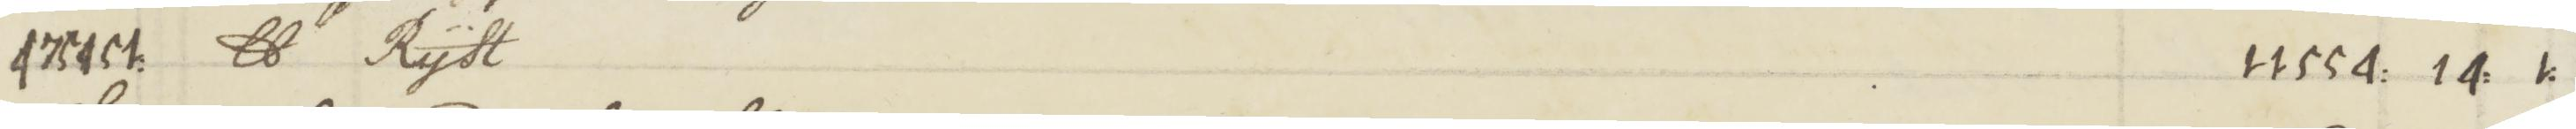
475451: lb Rijst 11554: 14: 1:
